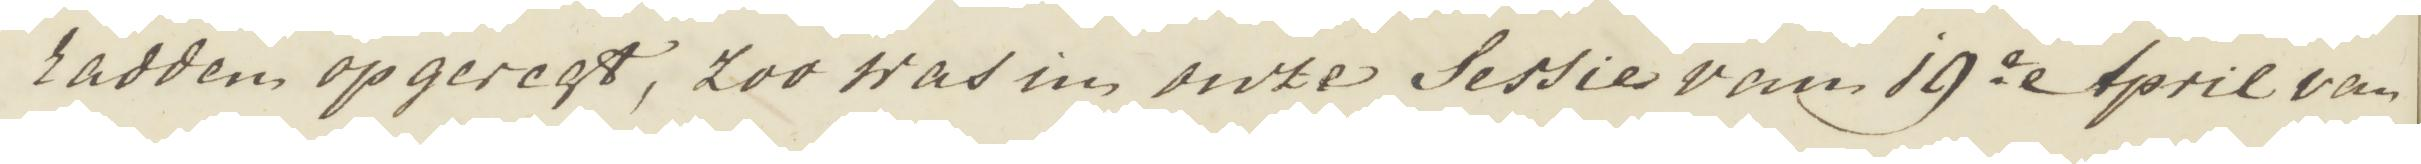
hadden opgeregt, zoo was in onze sessie van 19=e April van
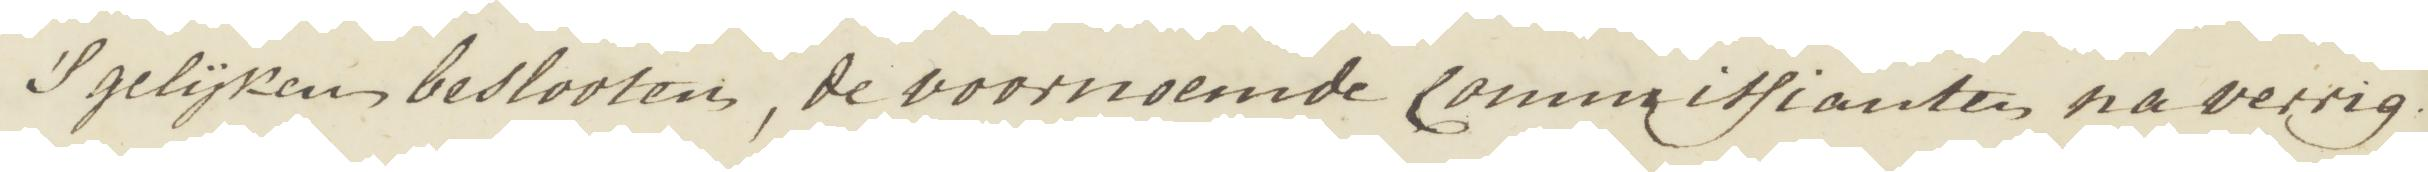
's gelijken beslooten, de voornoemde commissianten na verrig
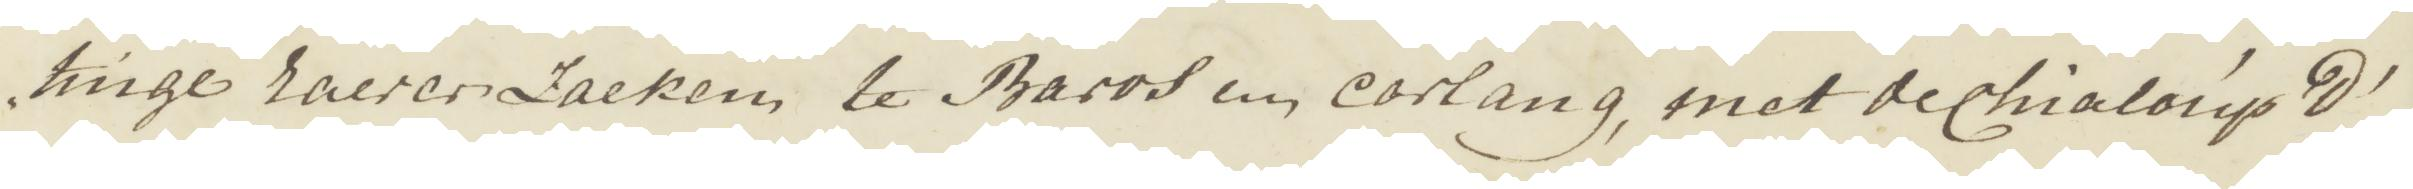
„tinge haerer zaeken te Baros en corlang, met de chialoup d'
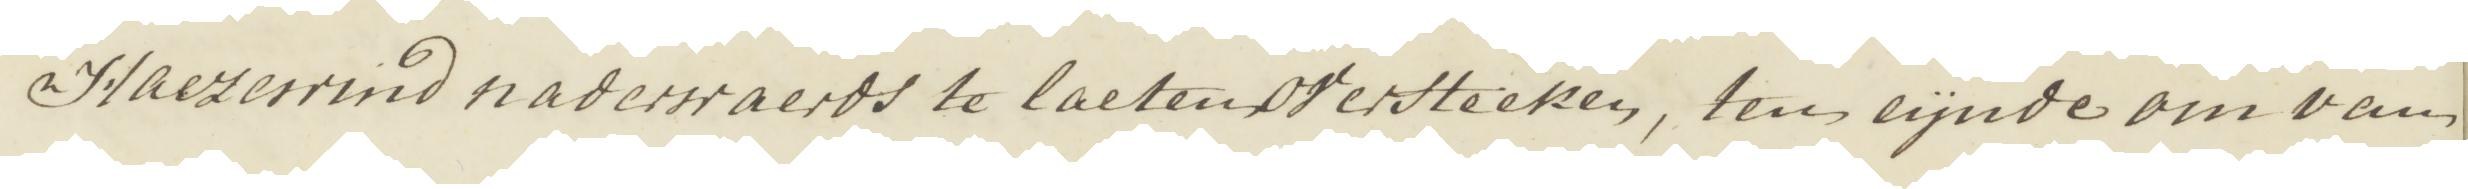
Haezewind naderwaerds te laeten versteeken, ten eijnde om van
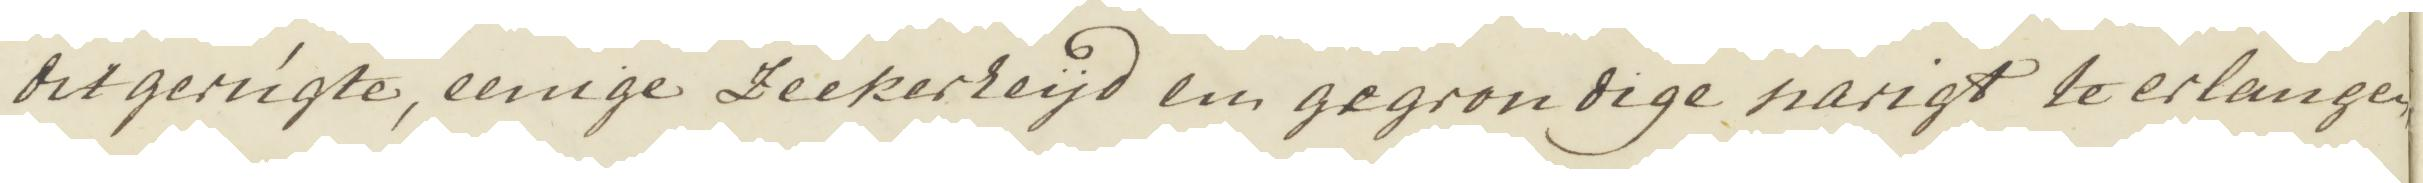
dit gerugte, eenige zeekerheijd en gegrondige narigt te erlangen
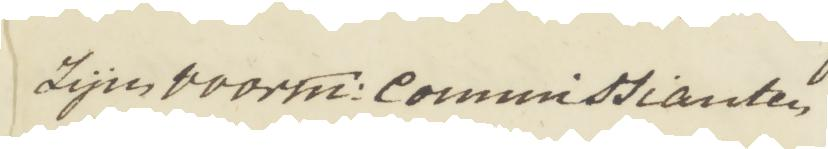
zijn voorm: commissianten
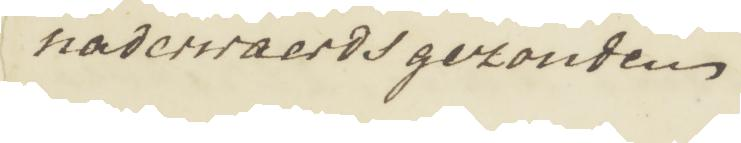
naderwaerds gezonden
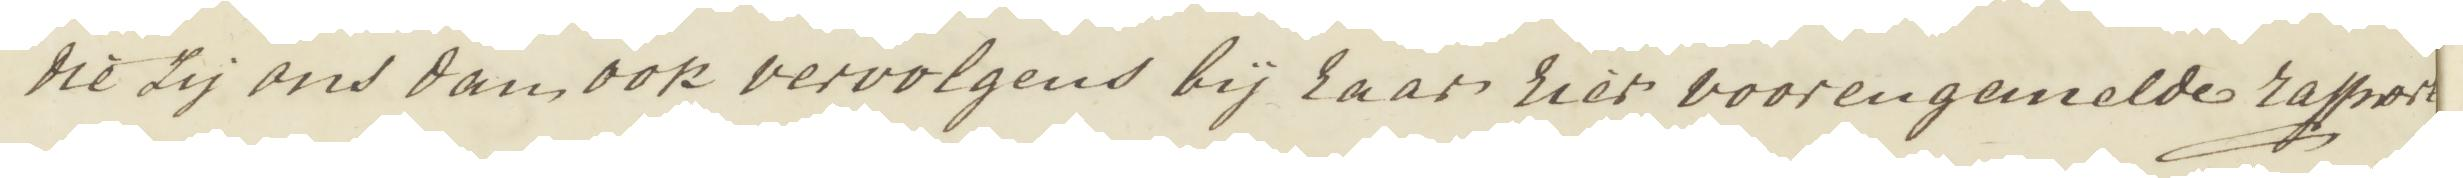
die zij ons dan ook vervolgens bij haar hier voorengemelde rapport
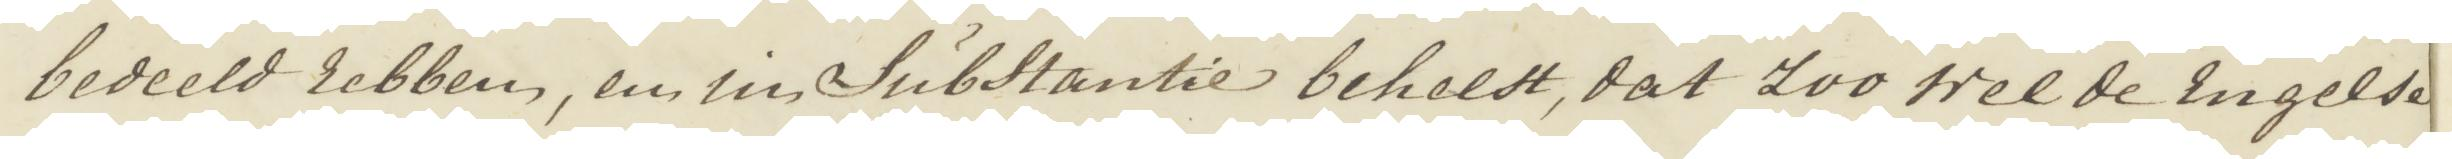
bedeeld hebben, en in substantie behelst, dat zoo wel de Engelse
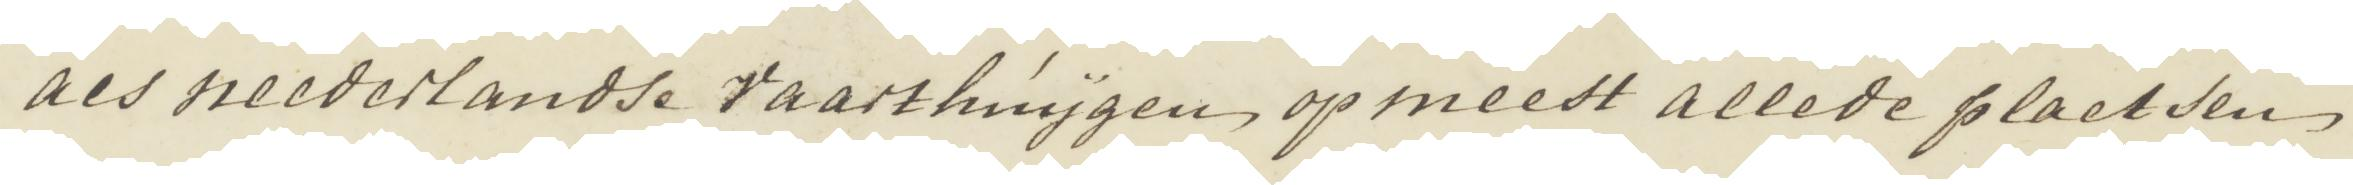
als neederlandse vaarthuijgen op meest allede plaetsen
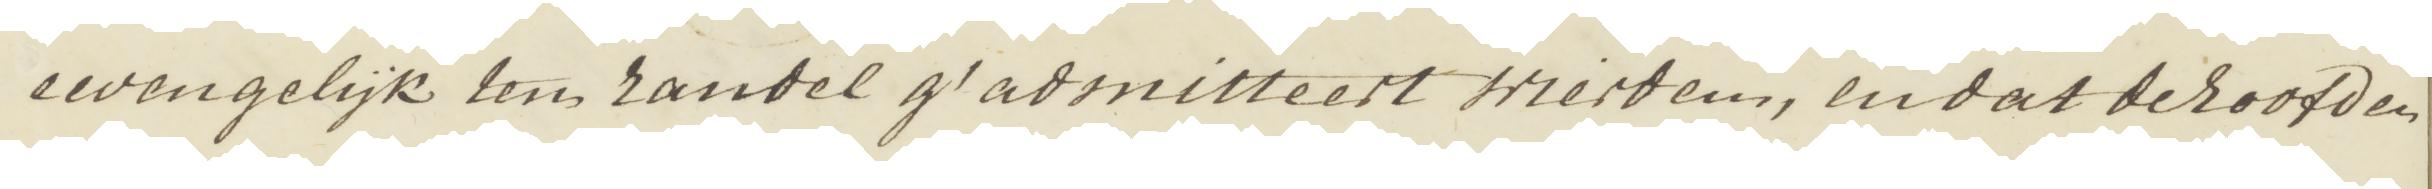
eevengelijk ten handel g’admitteert wierden, en dat de hoofden
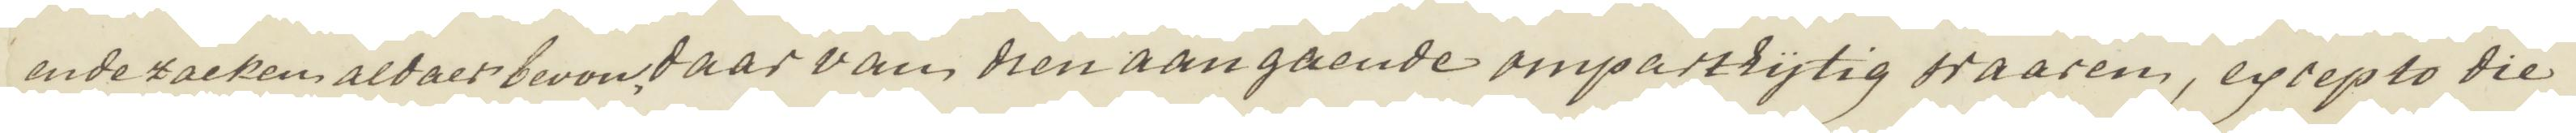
ende zaeken aldaer bevon„ daar van dien aangaende omparthijtig waaren, excepto die
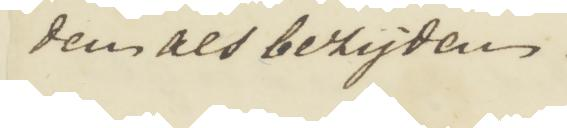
den als bezijden.
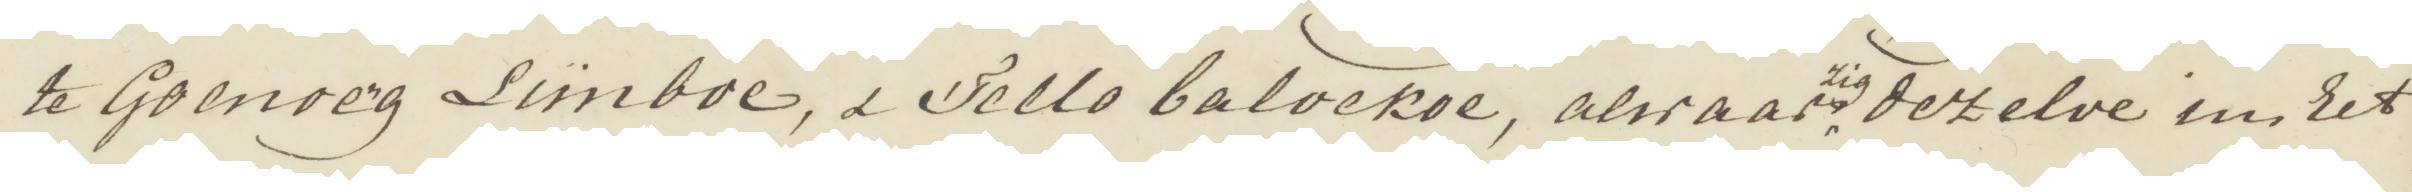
te Gonoeng Limboe, Tello baloekoe, alwaar ^zig dezelve in het
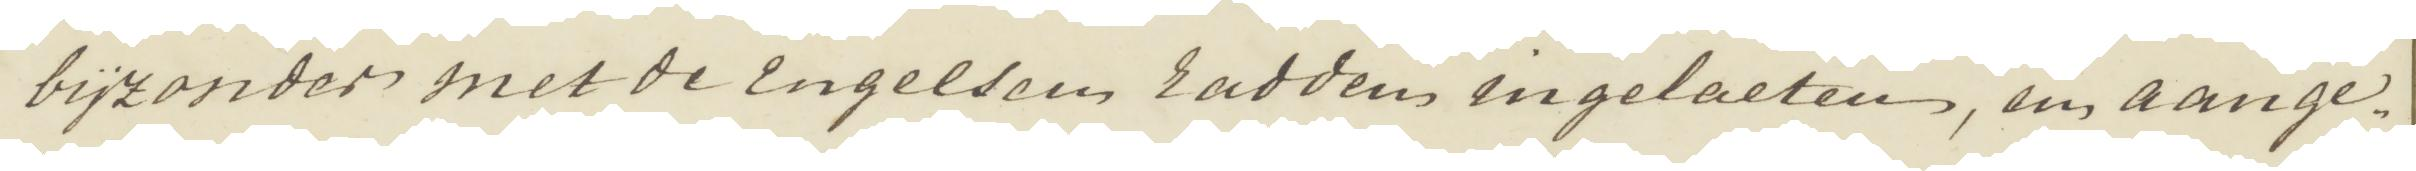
bijzonder met de Engelsen hadden ingelaeten, en aange„
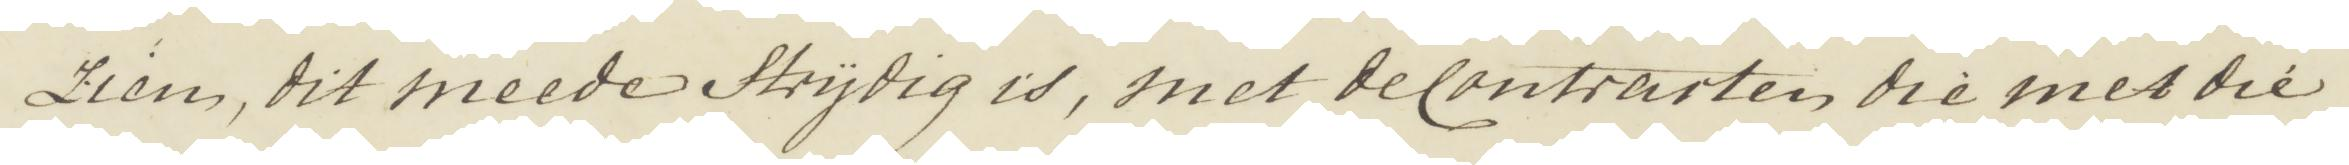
zien, dit meede strijdig is, met de contracten die met die
